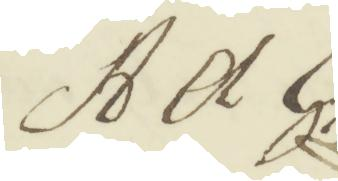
A d G.
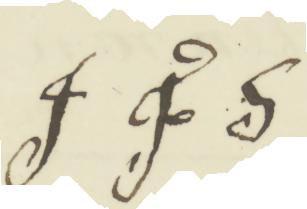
J J S
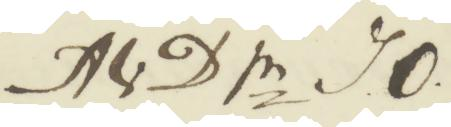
A V D jr JO.
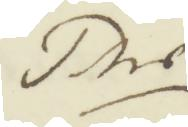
Phs
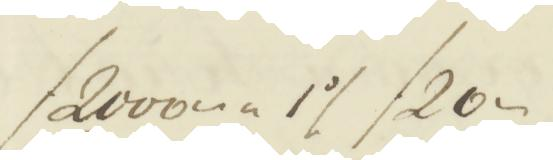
ƒ 2000: „ a 1% ƒ20.
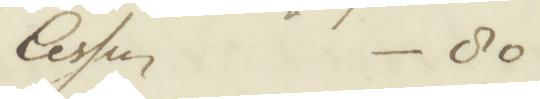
Cessien — 80
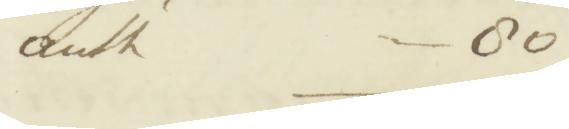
auth — 80
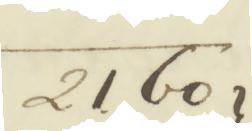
2160}
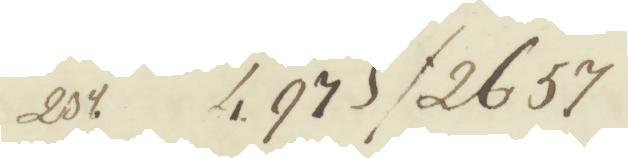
23% 4.97} ƒ2657
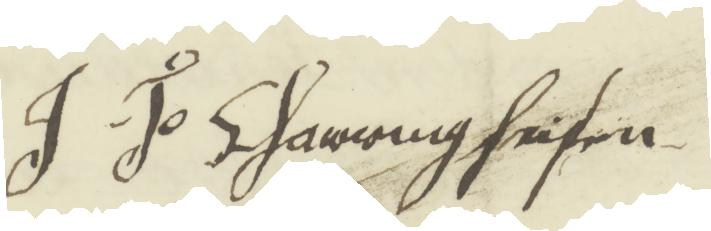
J F Scharringhuisen
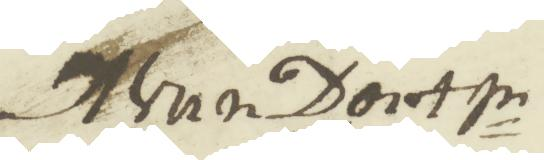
A van Dort jr:
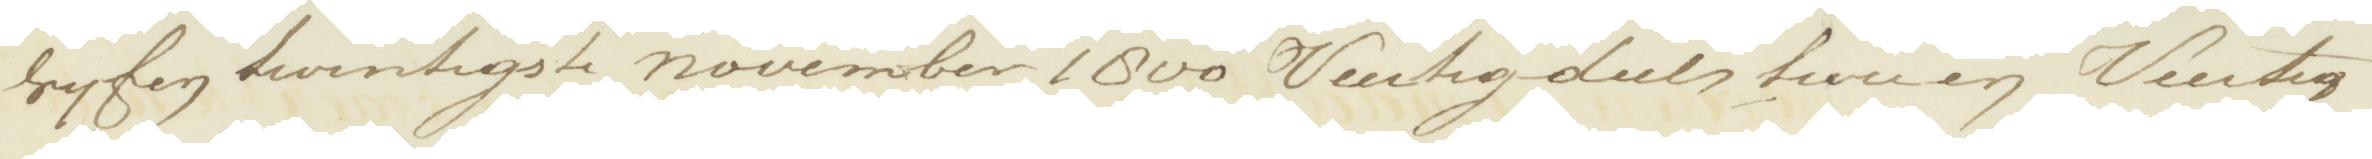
vijfen twintigste november 1800 Veertig deel twee en Veertig
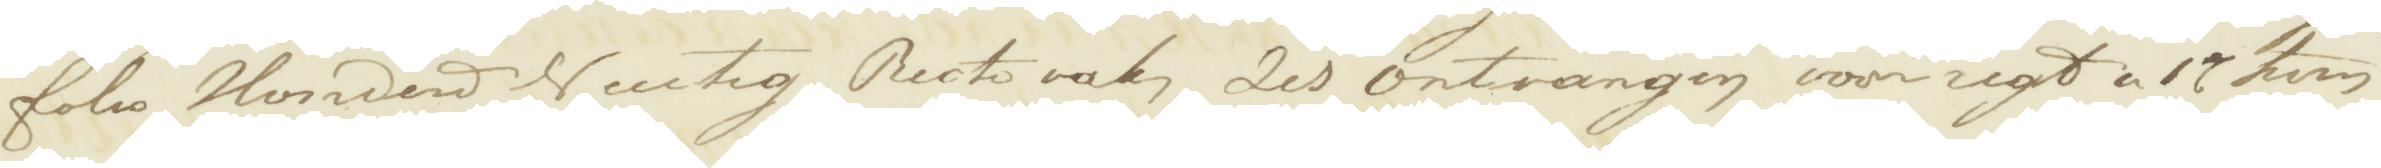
folio Honderd Veertig Recto vak zes ontvangen voor regt a 1% twin
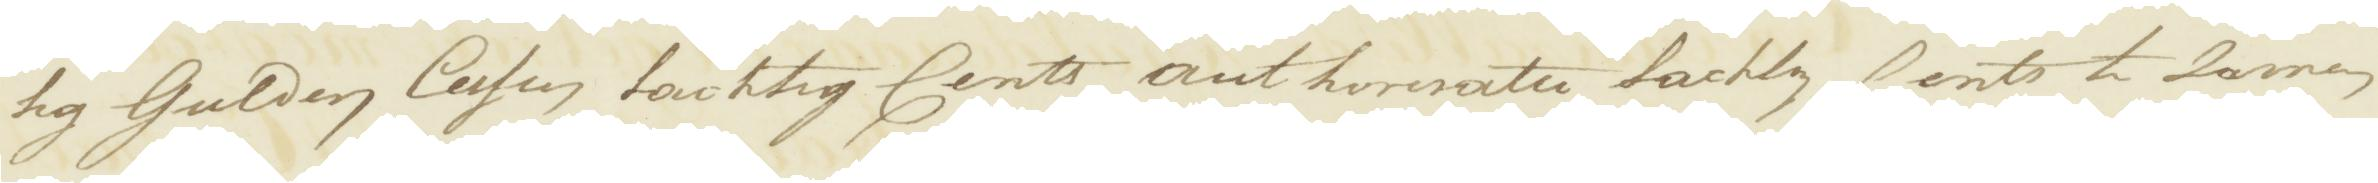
tig Gulden Cessien tachtig Cents authorisatie tachtig Cents te zamen
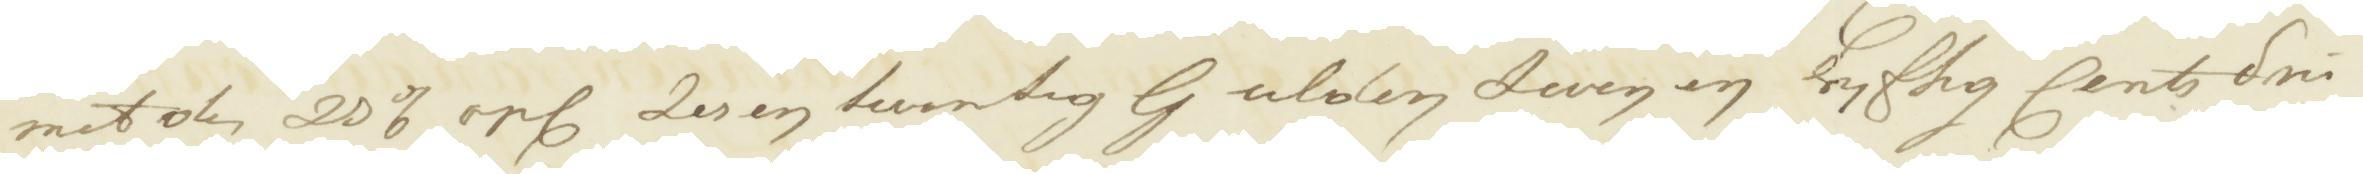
met den 23% opc Zes en twintig Gulden Zeven en Vyftig Cents drie
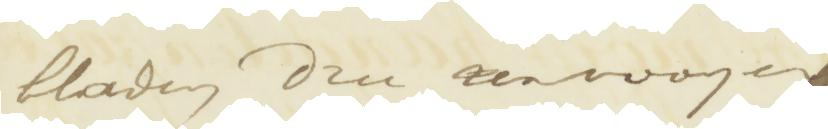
bladen drie renvooyen
